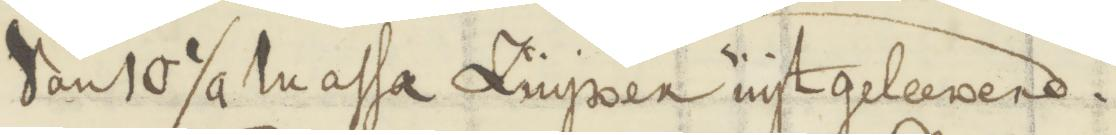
van 10¼ massa zuijver uijt geleeverd .
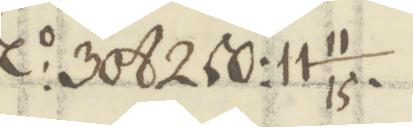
r:o 308250:11 11/15.
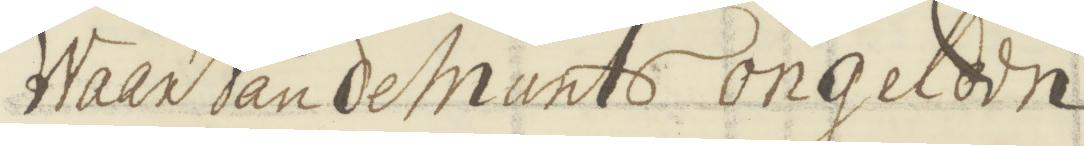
Waar Van de munts ongelden
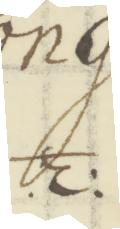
r:
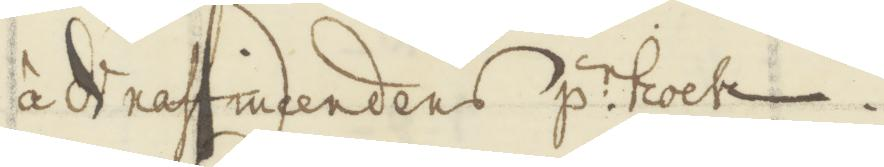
â de raffineerders p:r hoek .
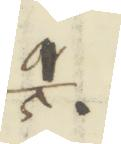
4/5.
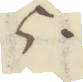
2/5.
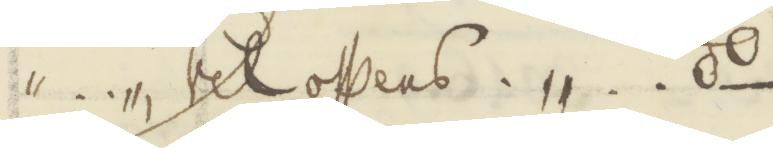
„ . . „ , kloppers . „ . . d_o
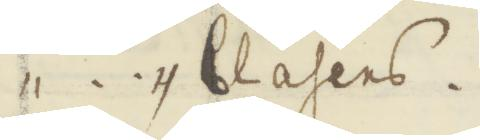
„ . . „ blasers .
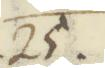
4/25.
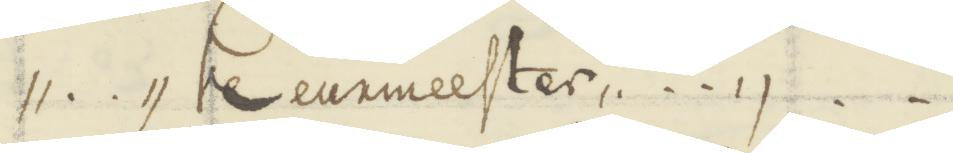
„ . . „ keurmeester „ - - „ . -
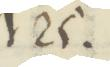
1 14/25.
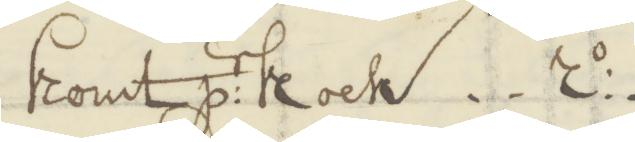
komt p:r koek - - r:o
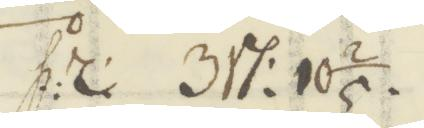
p:s r: 317: 10 2/5.
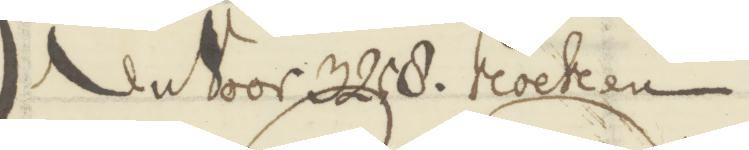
En Voor 3258. koeken
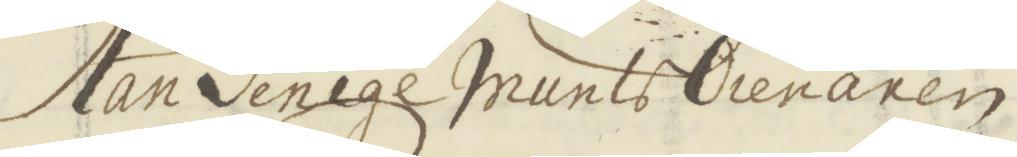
Aan Eenige munts dienaren
